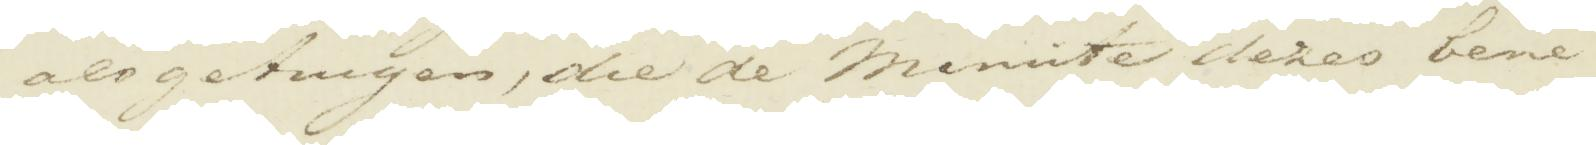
als getuigen, die de Minute dezes bene
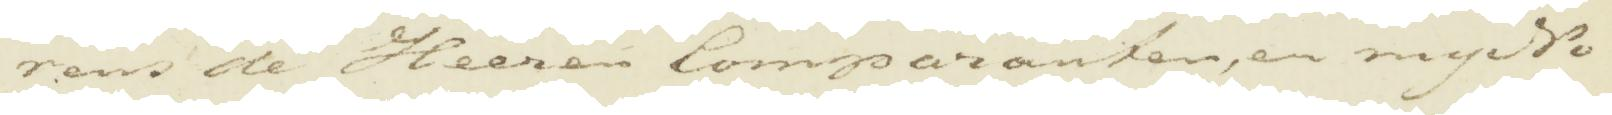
vens de Heeren Comparanten, en my No
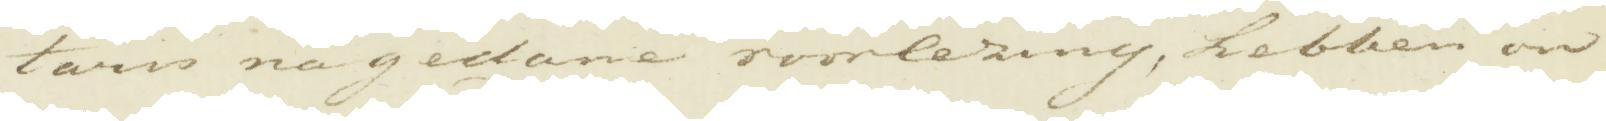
taris na gedane voorlezing, hebben on
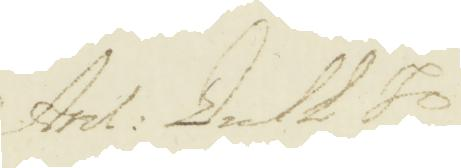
Art: Dull Io
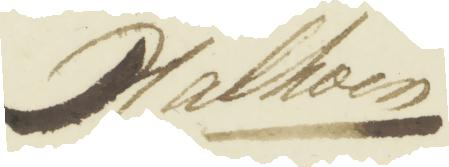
ICalkoen.
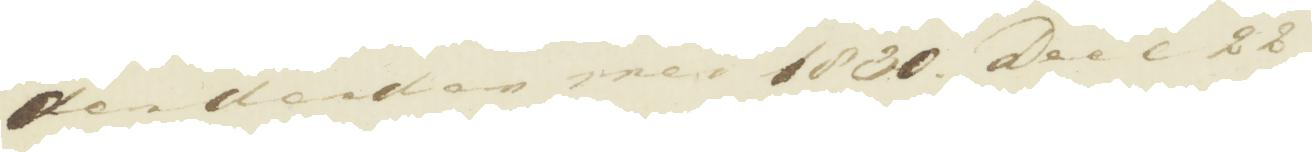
den derden mei 1830. Deel 22
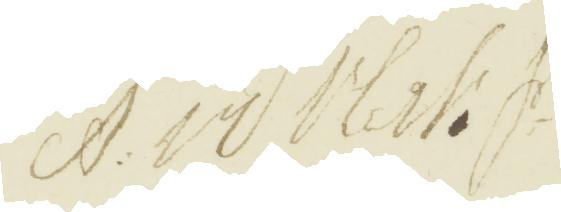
A: vd Vlerk J_r
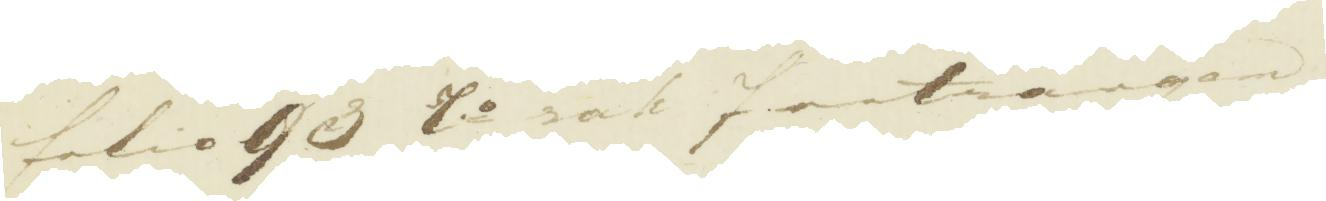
folio 93 7=e vak ontvangen
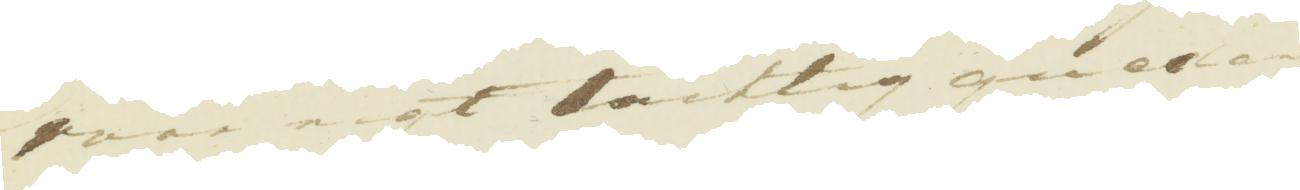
voor regt tachtig guldens
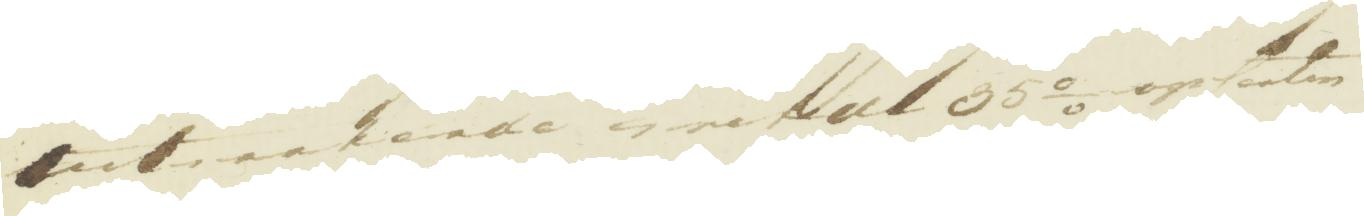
uitmakende met de 35% opCenten
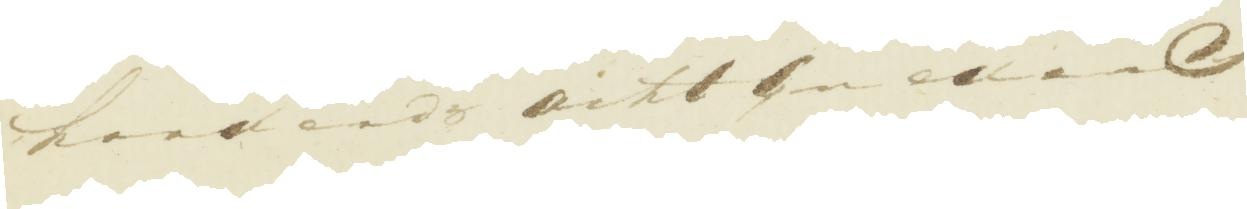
honderd & acht Guldens.
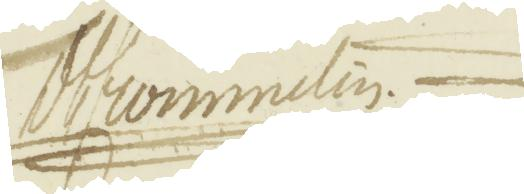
DHCrommelin
